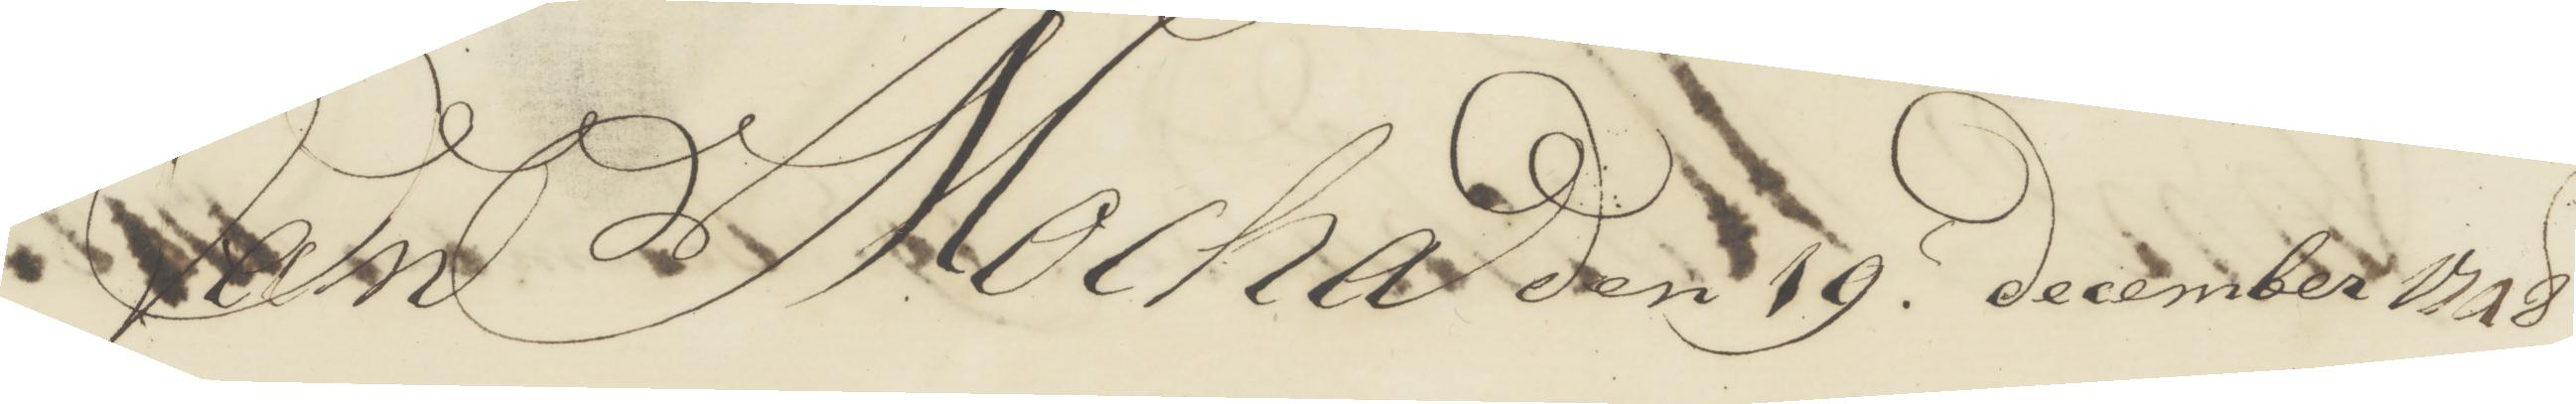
Van Mocha den 19.' december 1748
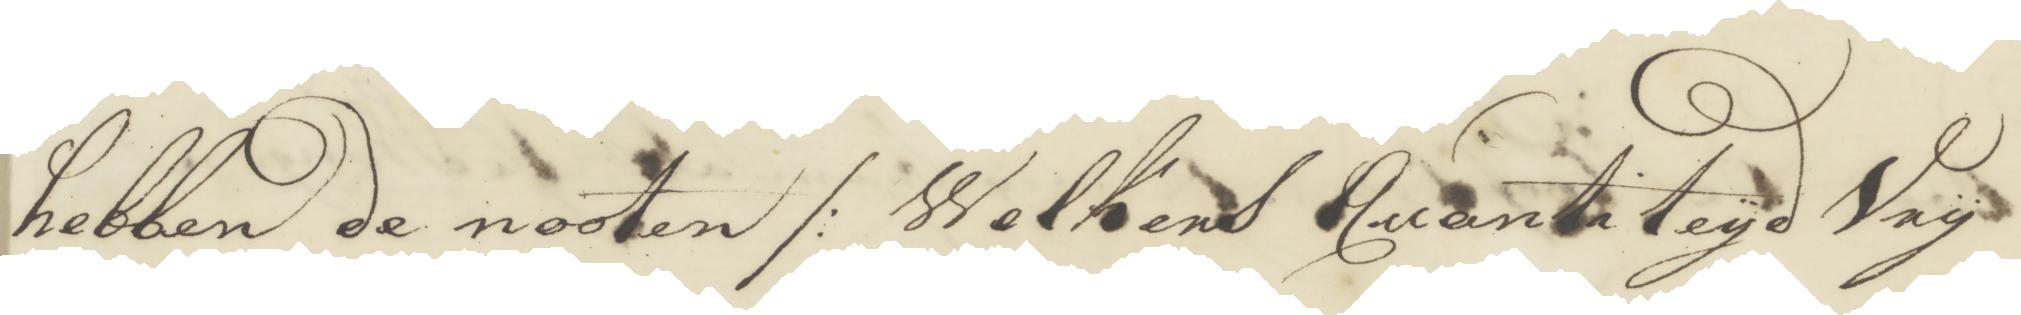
hebben de nooten /: welkens quantiteijd vrij
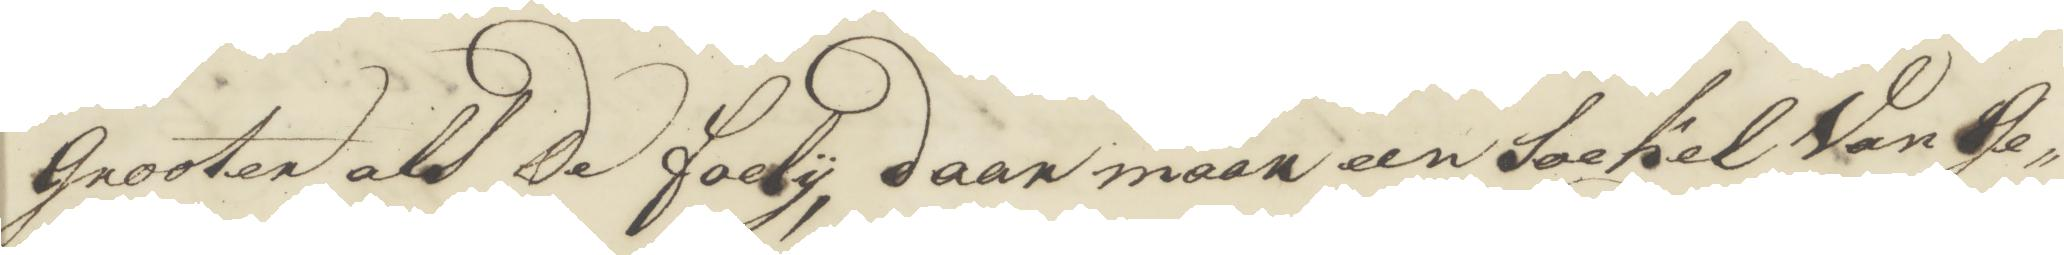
grooter als de foelij, daar maar een soekel van ge„
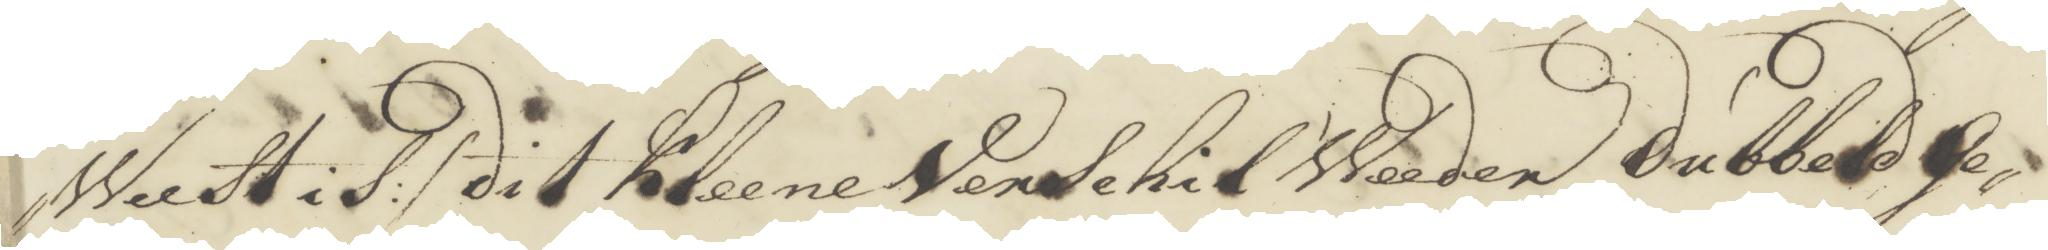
„weest is :/ dit kleene verschil weeder dubbeld ge„
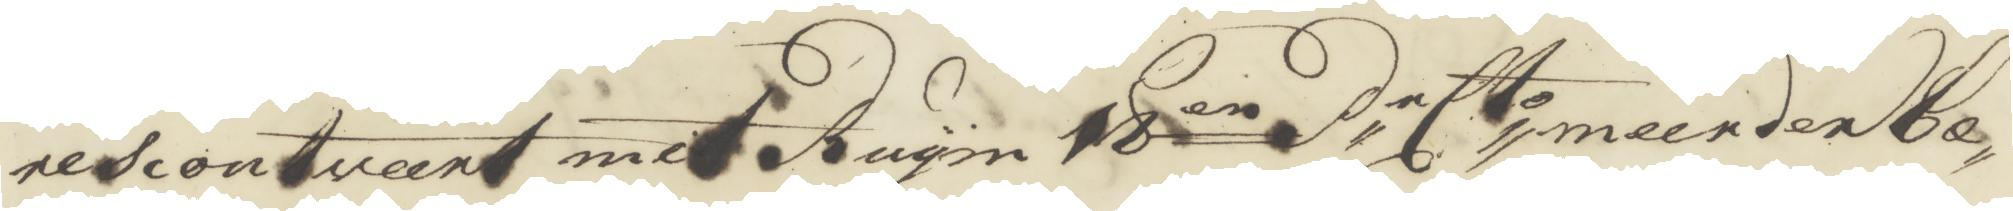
rescontreert met Ruijm 18=en P„r C„to meerder be„
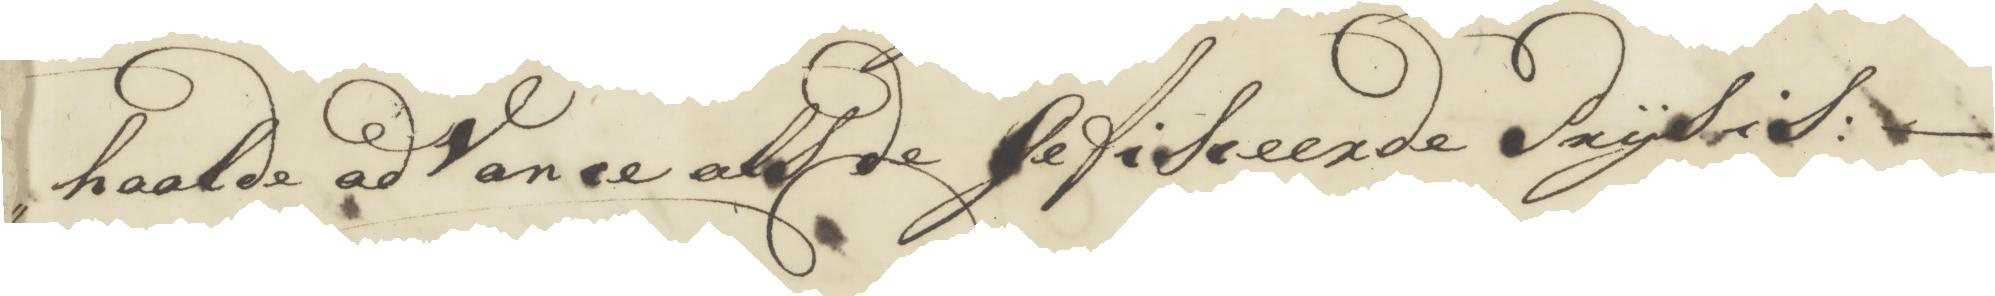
„haalde advance als de gefisceerde Prijs is: —
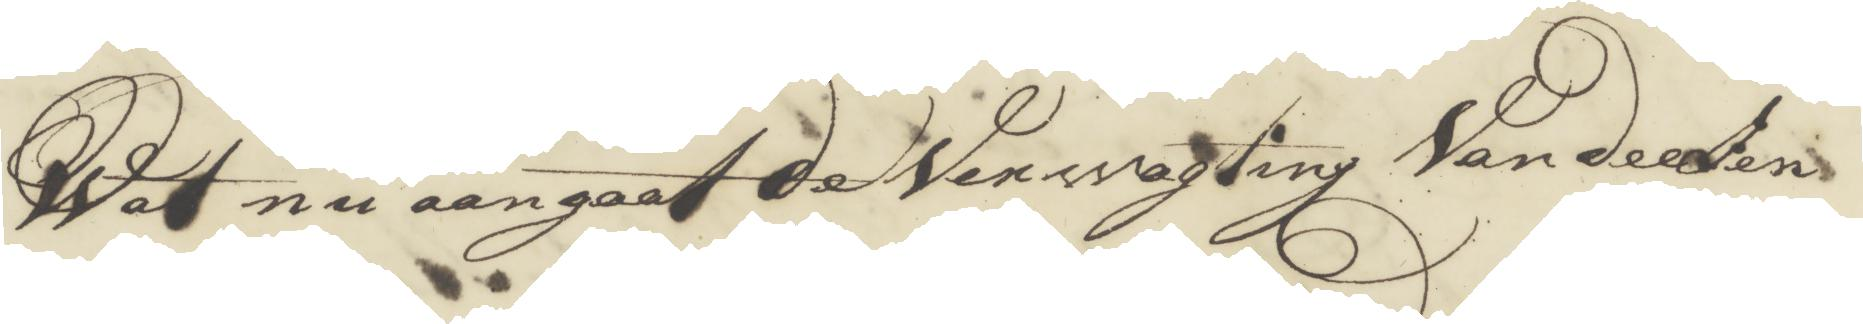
Wat nu aangaat de verwagting van deezen
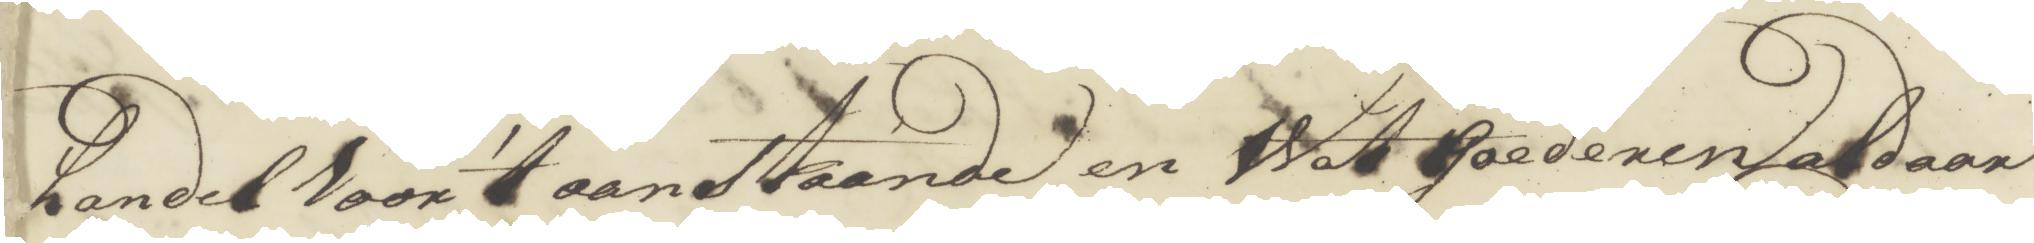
handel voor ’t aanstaande, en wat goederen aldaar
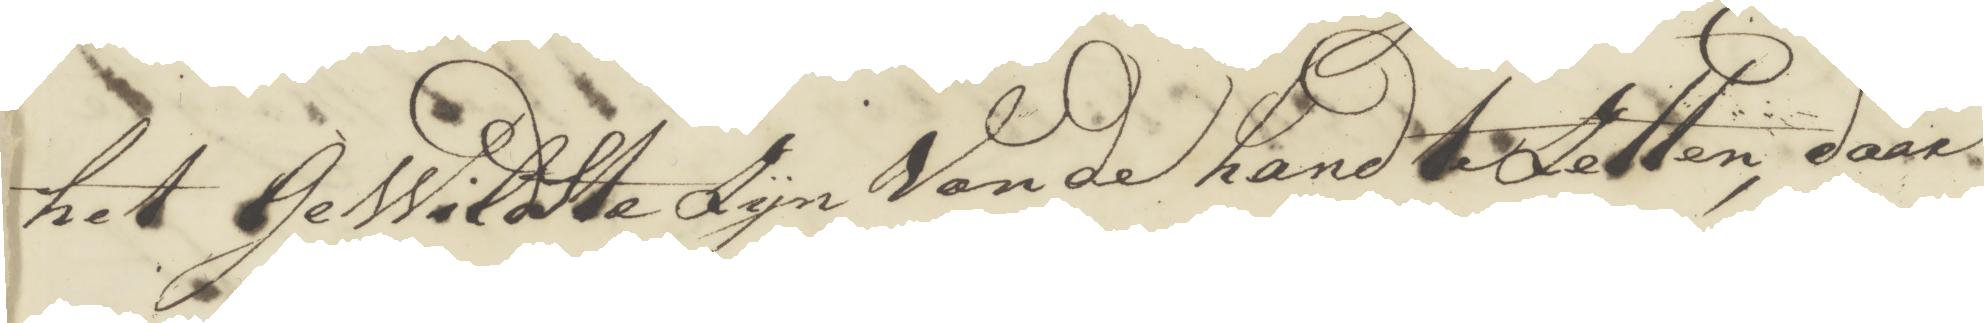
het gewildste zijn van de hand te zetten, daar
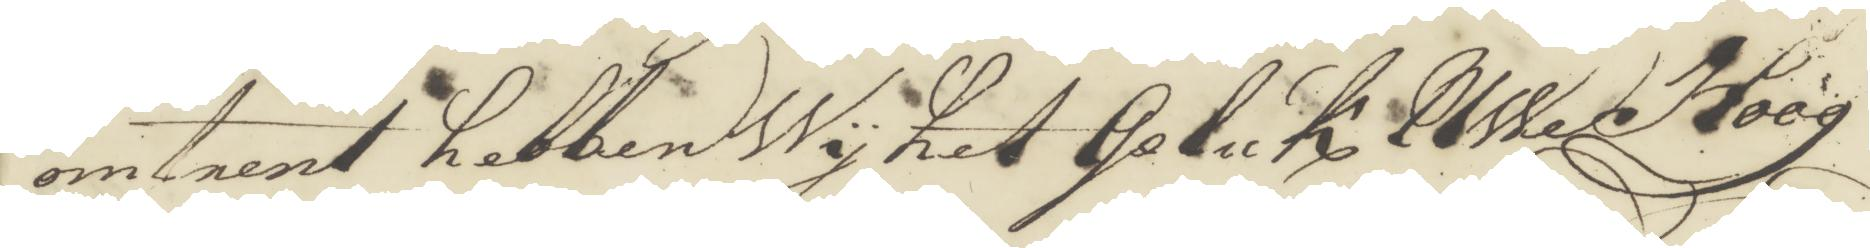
omtrent hebben wij het Geluk Uwe Hoog
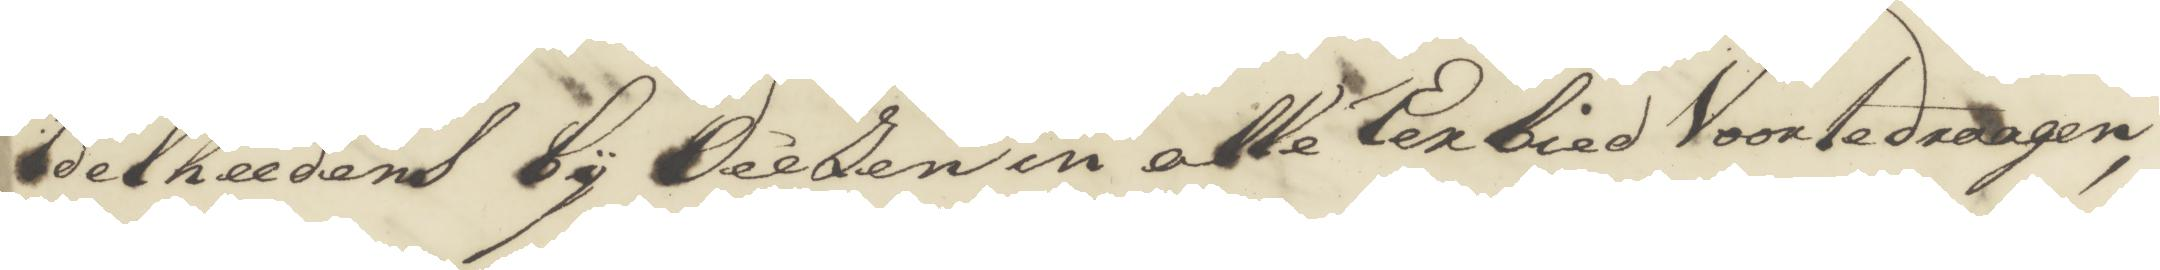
Edelheedens bij deezen in alle Eerbied voor te draagen,
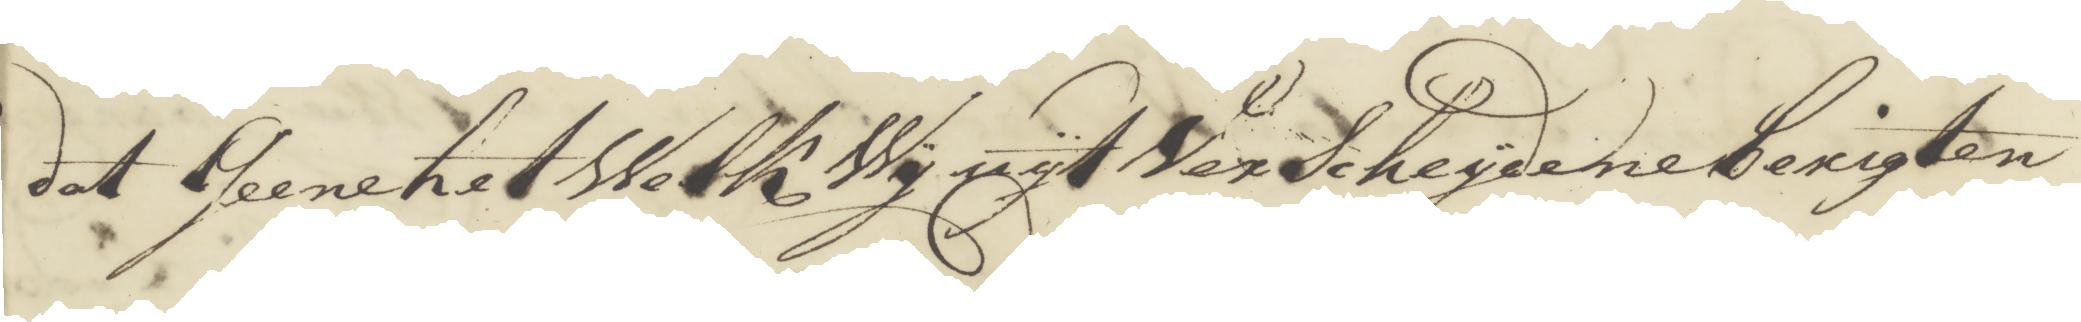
dat geene het welk wij uijt verscheijdene berigten
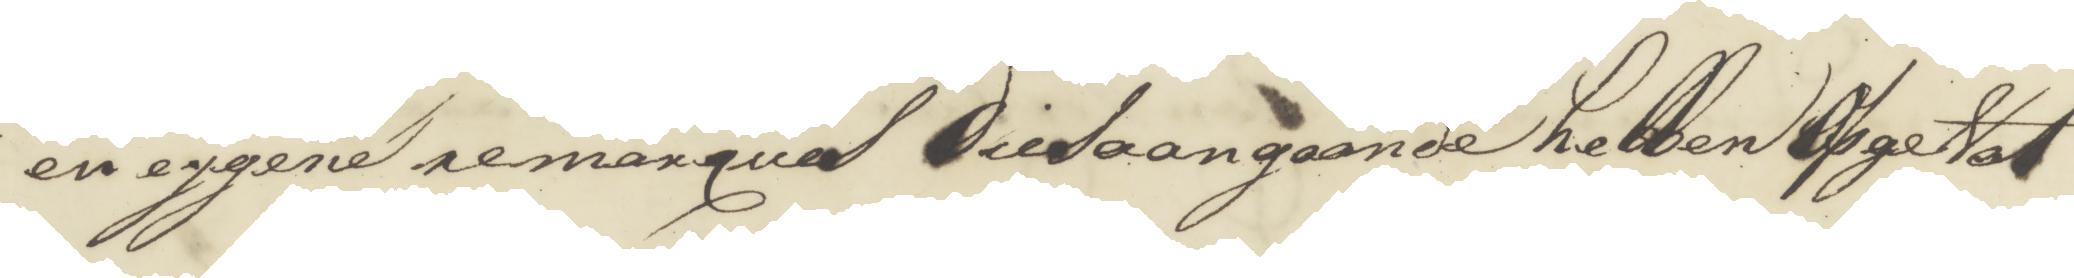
en eijgene remarques dies aangeende hebben opgevat
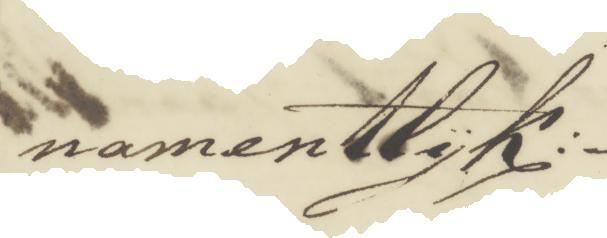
namentlijk:
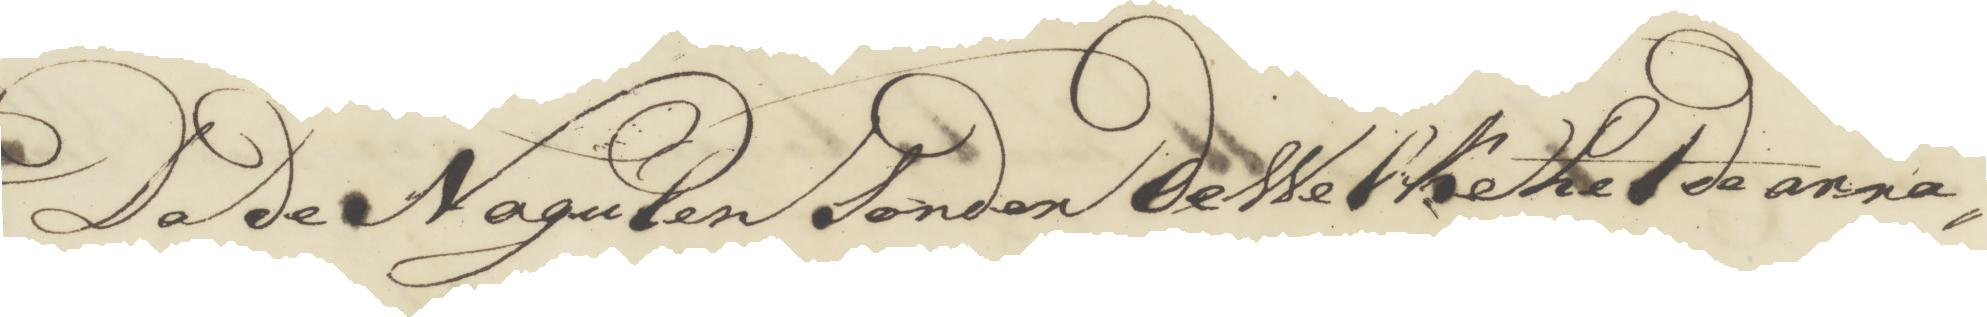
Dat de Nagulen sonden de welke het de arra„
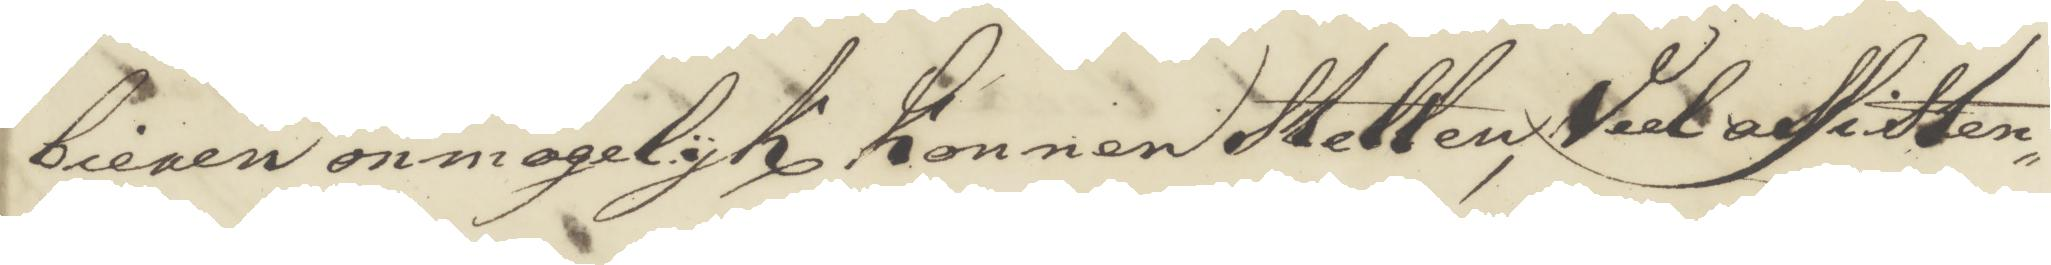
bieren onmogelijk konnen stellen, veel assisten„
